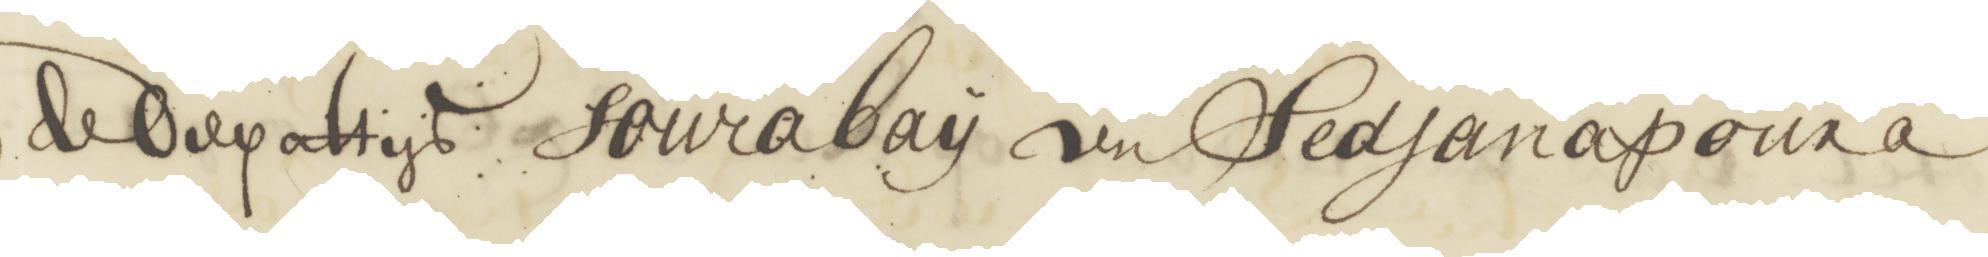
de depattijs sourabaij en Sedjanapoura
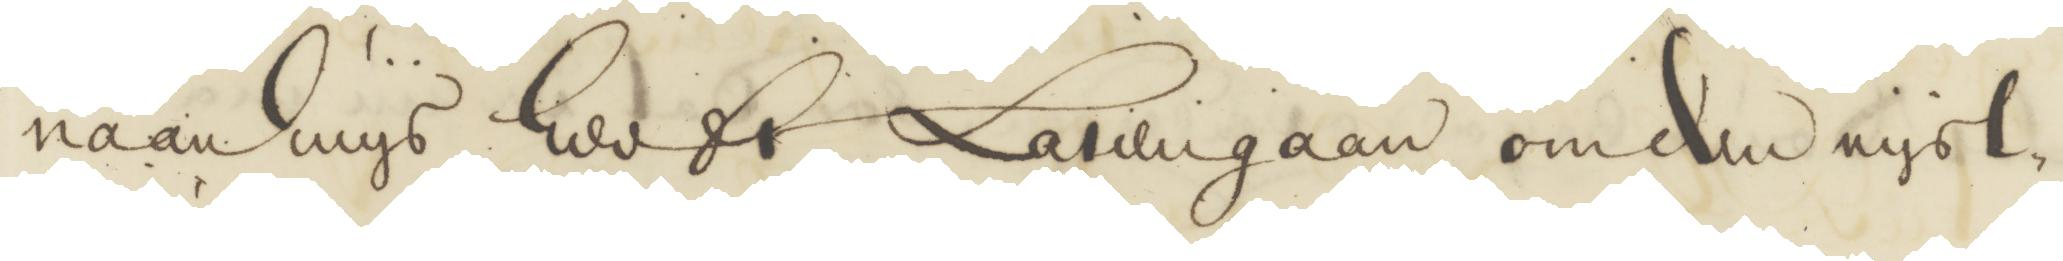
naar huijs heeft Laten gaan om den rijst„
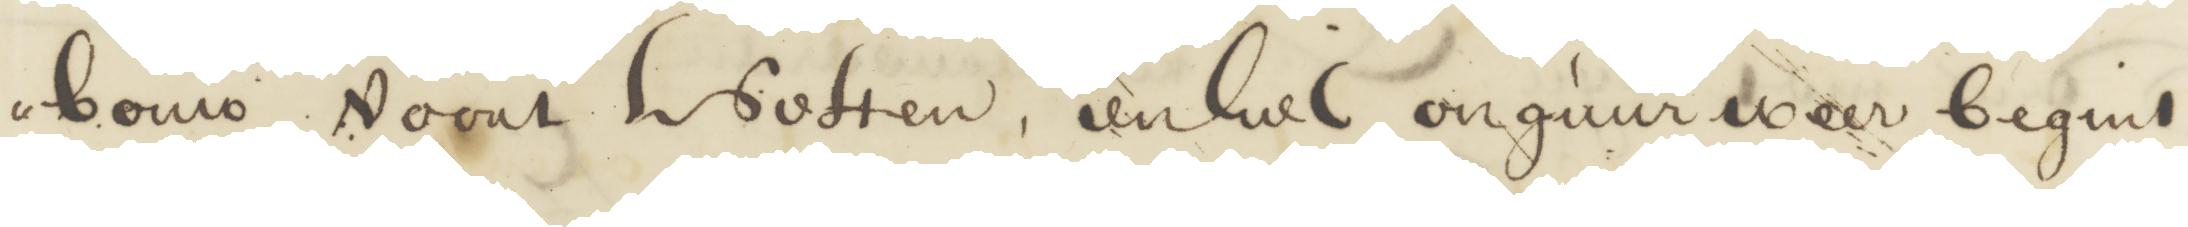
„bouw voort te setten, en het onguur weer begint
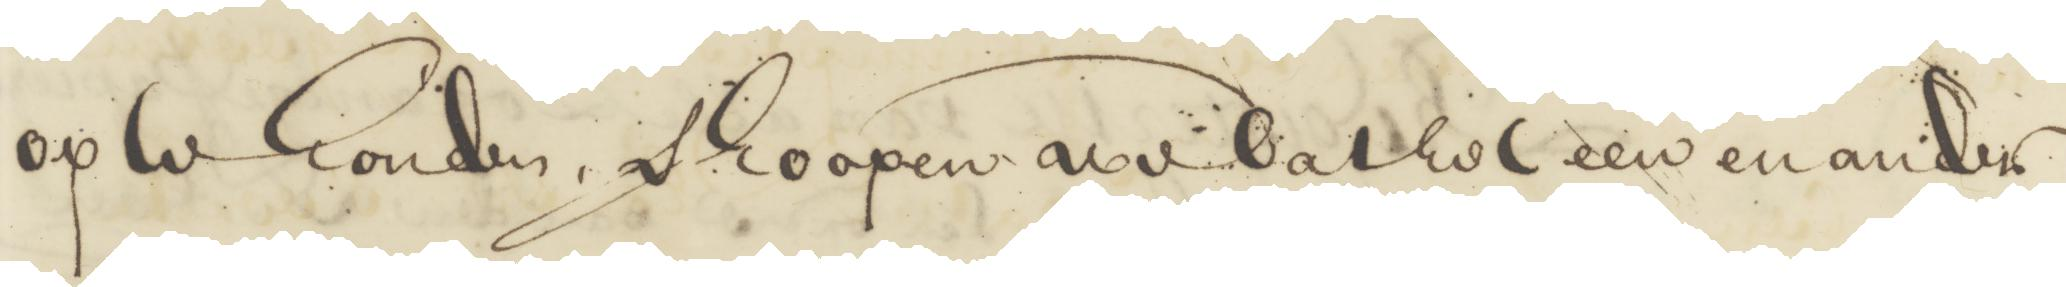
op te houden, verhoopen we dat het een en ander
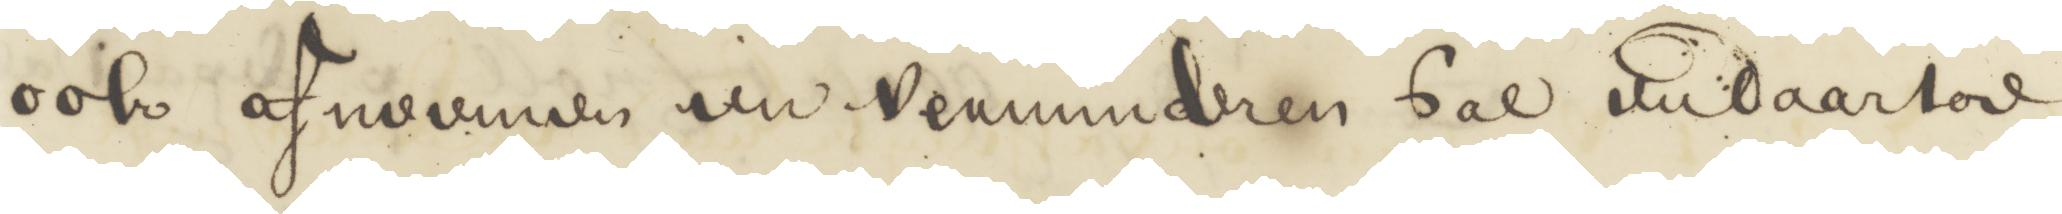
ook afneemen en verminderen sal en daar toe
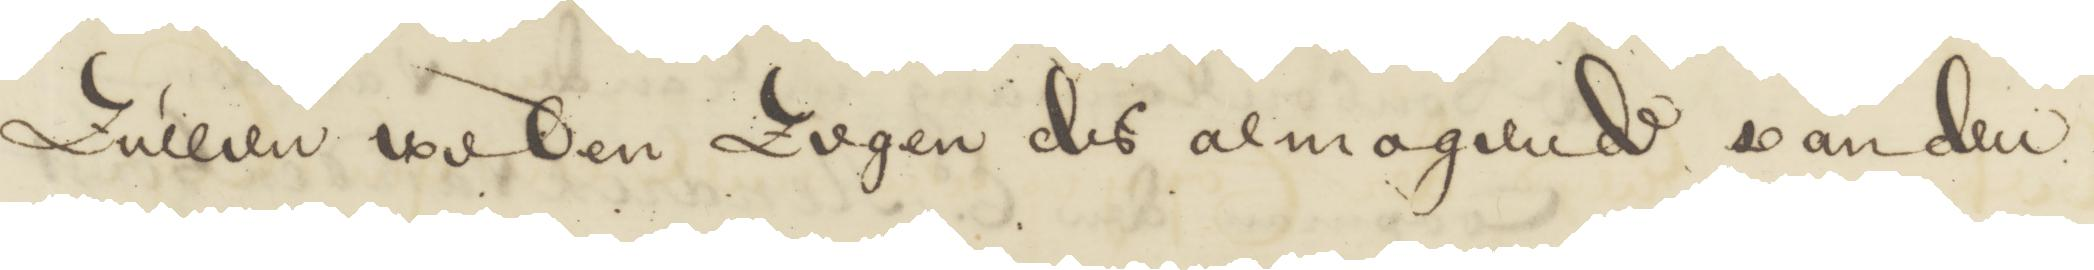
Zullen we den Zegen des almogende van den
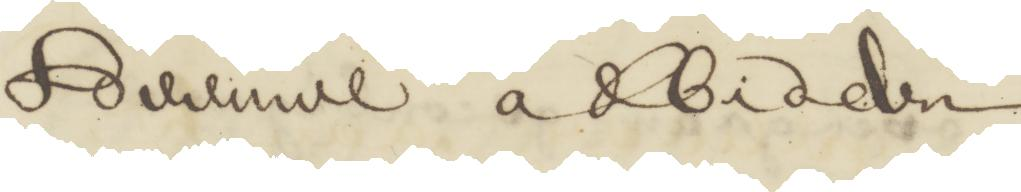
Heemel afbidden
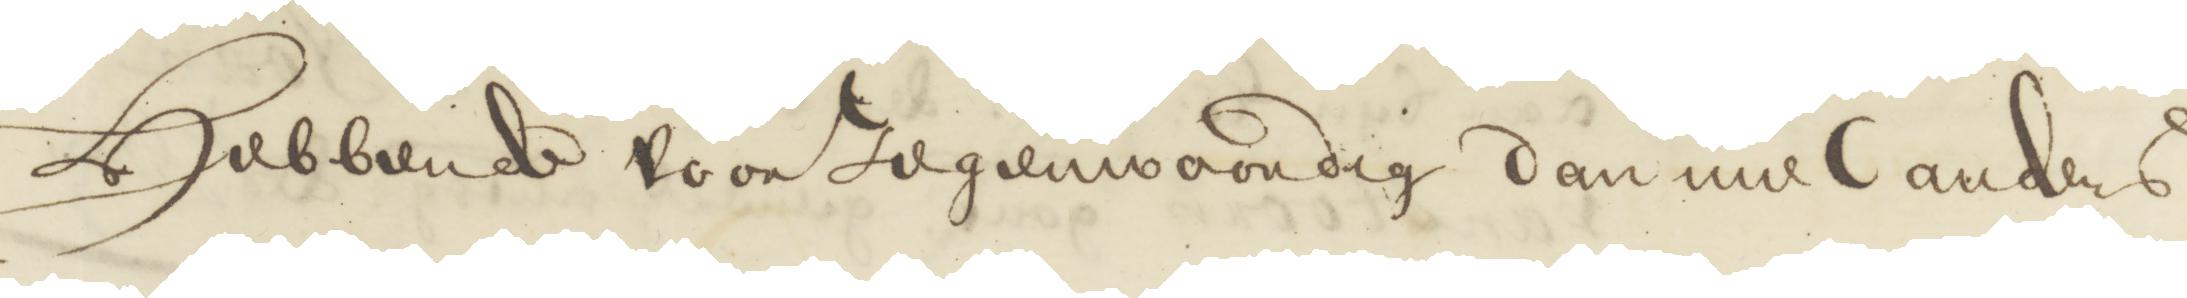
Hebben de voor Iegenwoordig dan niet anders
